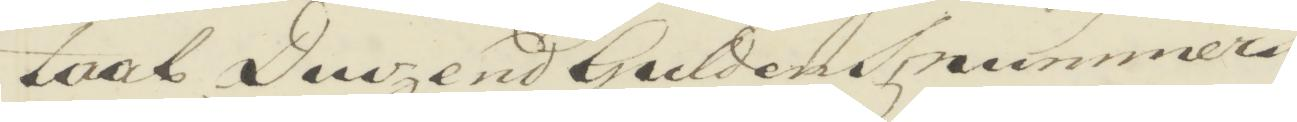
taal Duizend Guldens nummers
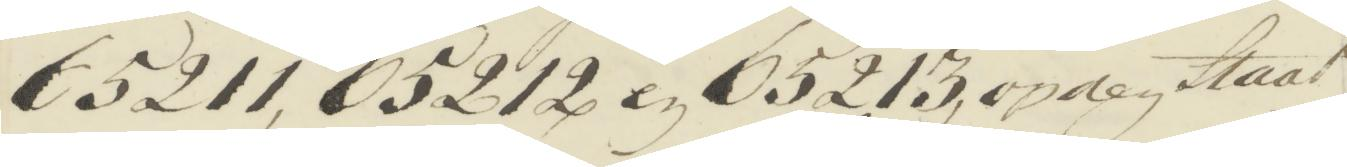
65211, 65212 en 65213, op den Staat
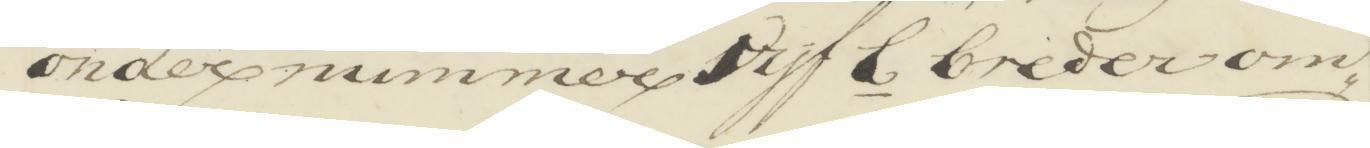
onder nummer Vijf L breder om„
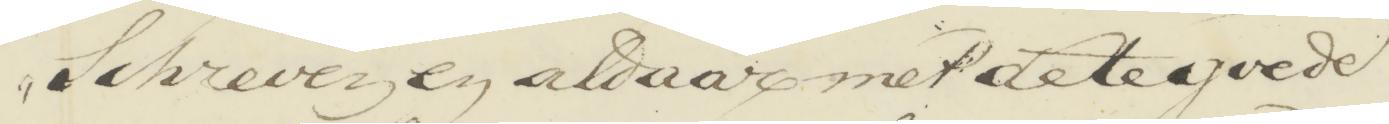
„schreven en aldaar met detegoede
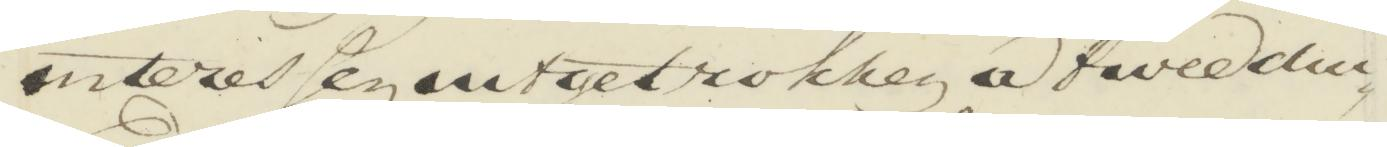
interessen uitgetrokken a twee dui„
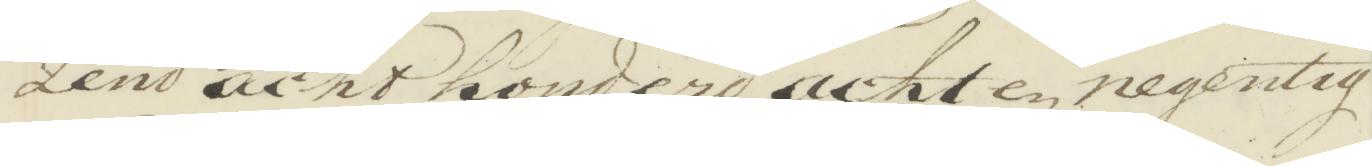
zend acht honderd acht en negentig
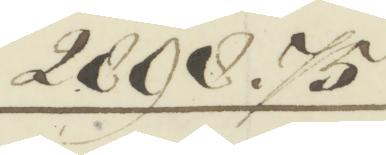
2898.75
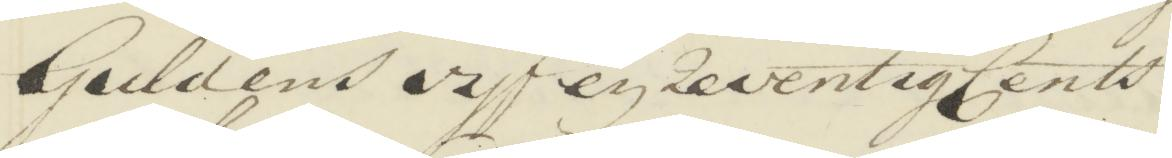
Guldens vyf en zeventig Cents
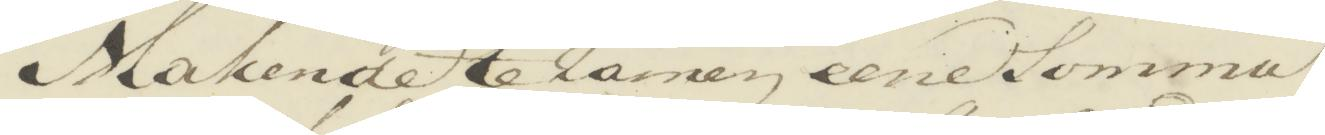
Makende te zamen eene somma
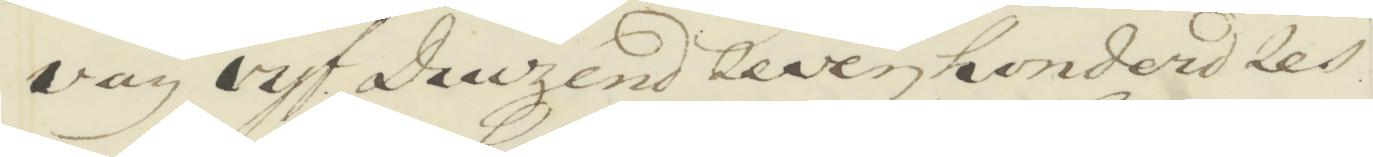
van vyf Duizend zeven honderd zes.
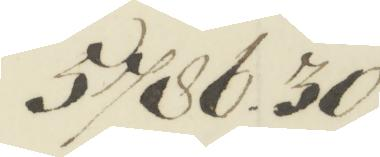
5786.30
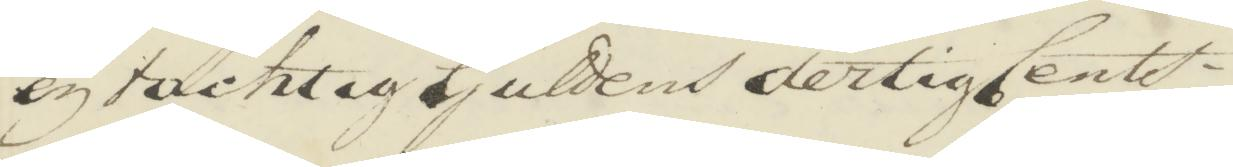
en tachtig Guldens dertig Cents-
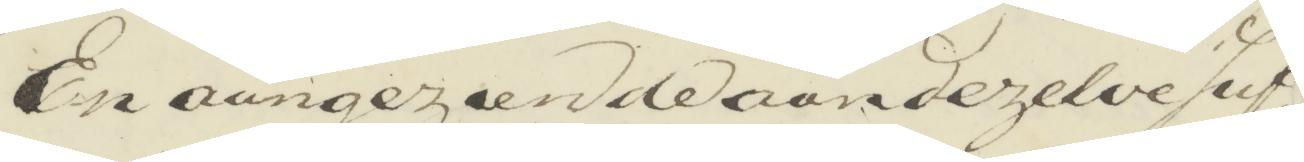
En aangezien de aan dezelve Juf
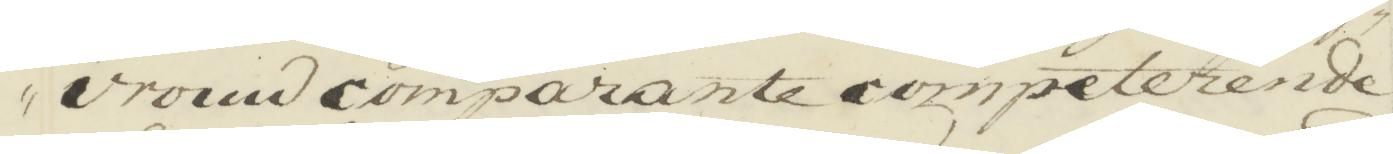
„vrouw comparante competerende
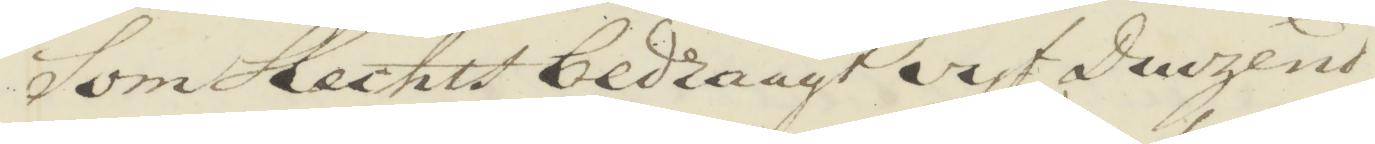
Som Slechts bedraagt vyf Duizend
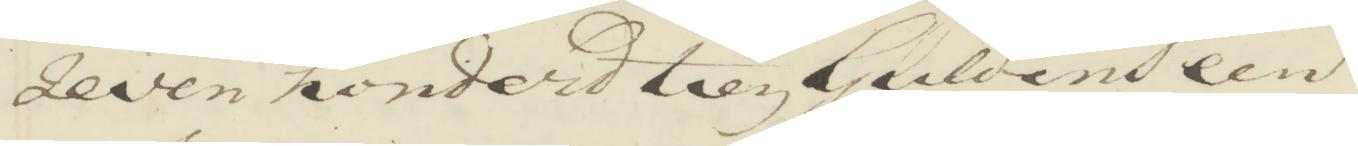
zeven honderd tien Guldens een
